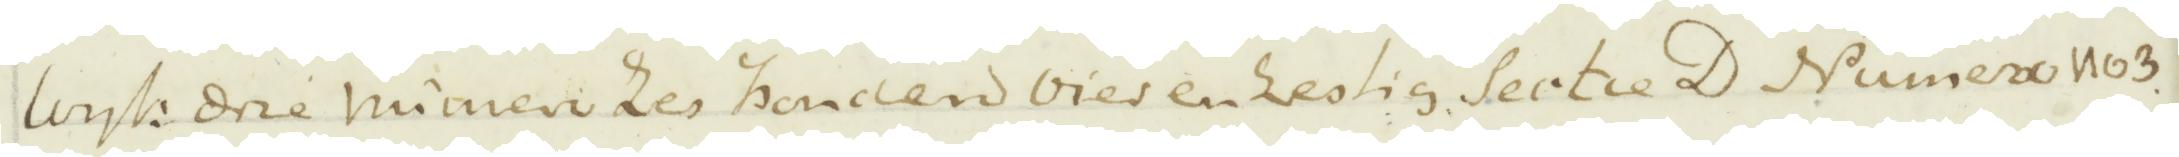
Wyk drie Numero zes honderd vier en zestig sectie D Numero 1103,
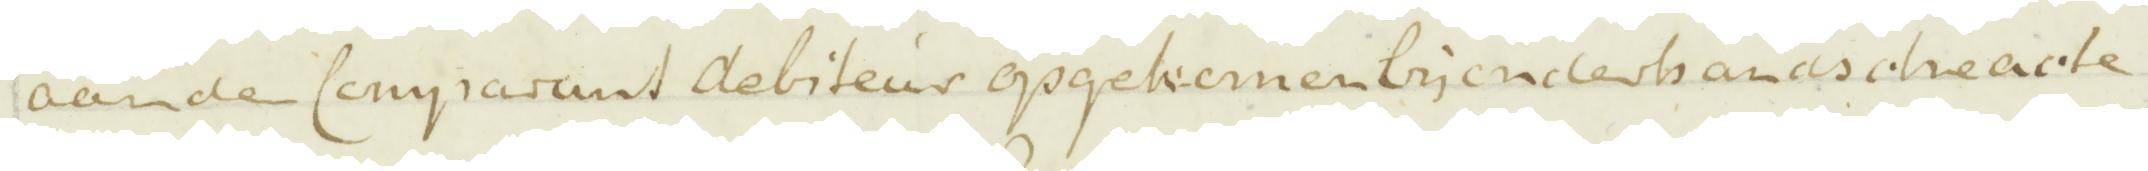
aan den Comparant debiteur opgekomen bij onderhandsche acte
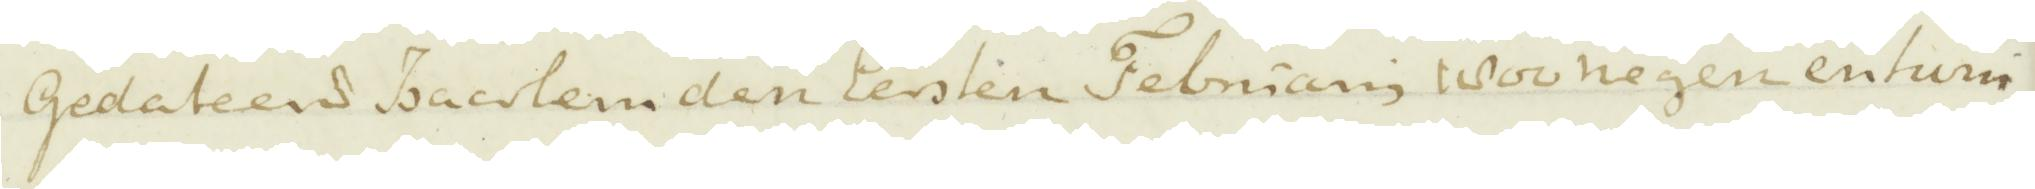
Gedateerd Haarlem den Eersten Februarij 1800 negen en twin
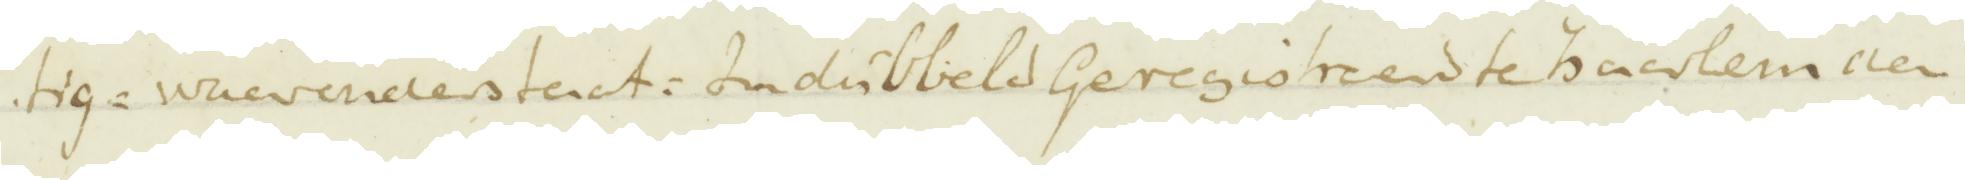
tig= waeronder staat: In dubbeld Geregistreerd te haarlem den
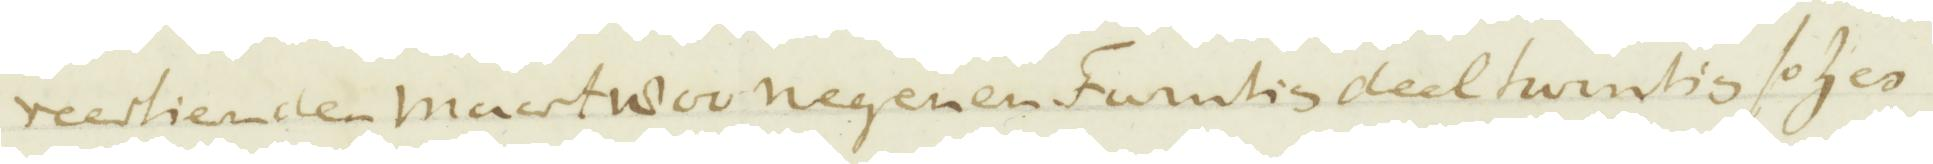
veertienden maart 1800 negen en Twintig deel twintig fo Zes
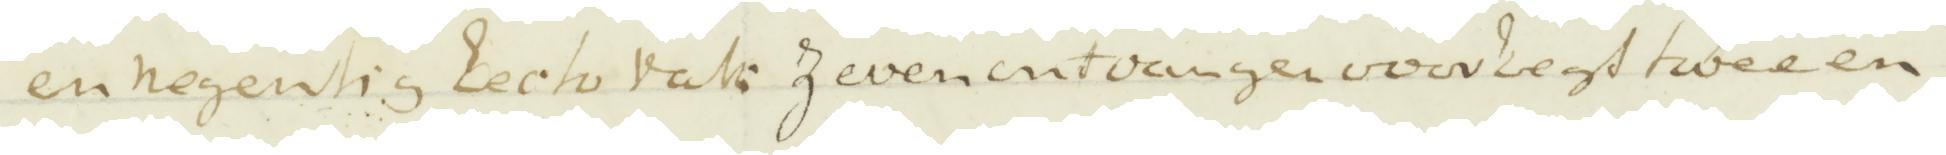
en negentig Recto vak Zeven ontvangen voor Regt twee en
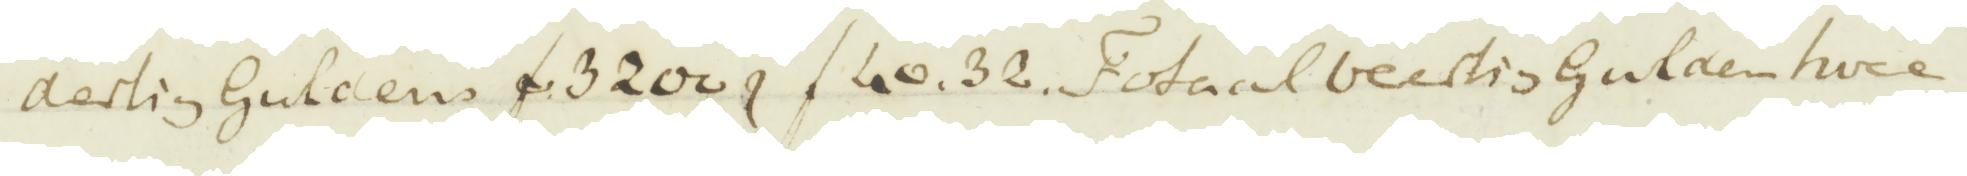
dertig Guldens ƒ. 3200 } ƒ 40. 32. Totaal veertig Gulden twee
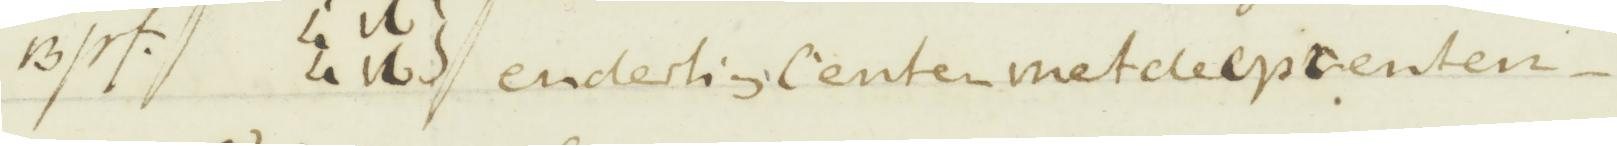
13/ct. 4 16 4 16 } en dertig Centen met de opcenten —
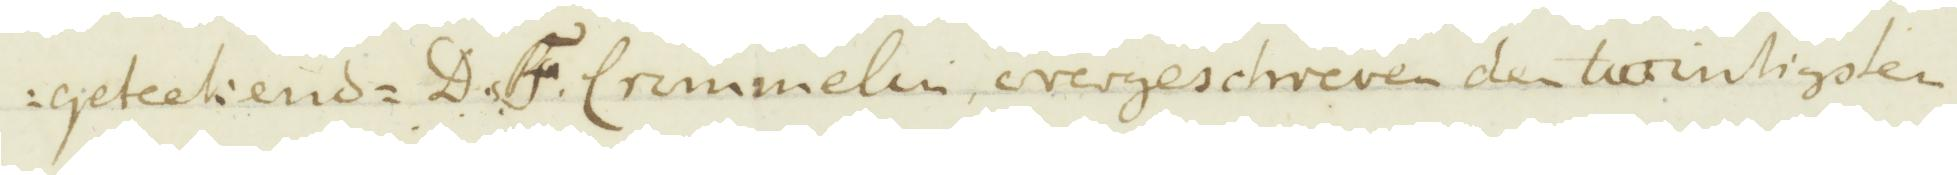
= geteekend = D: F. Crommelin, overgeschreven den twintigsten
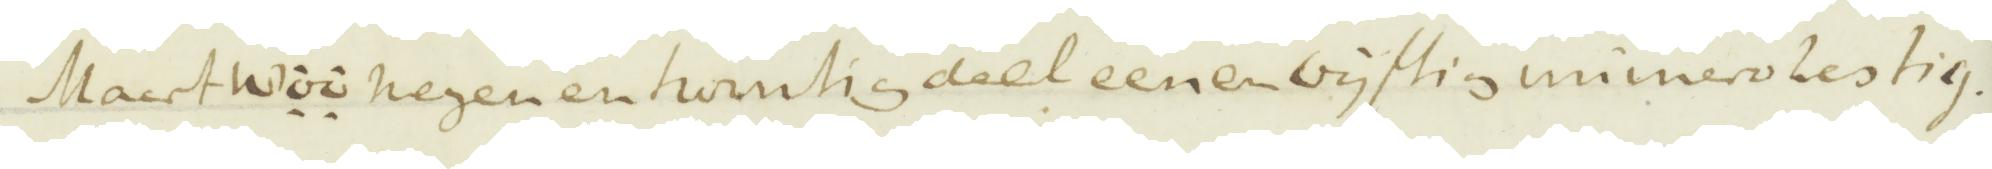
Maart 1800 negen en twintig deel een en vijftig numero zestig.
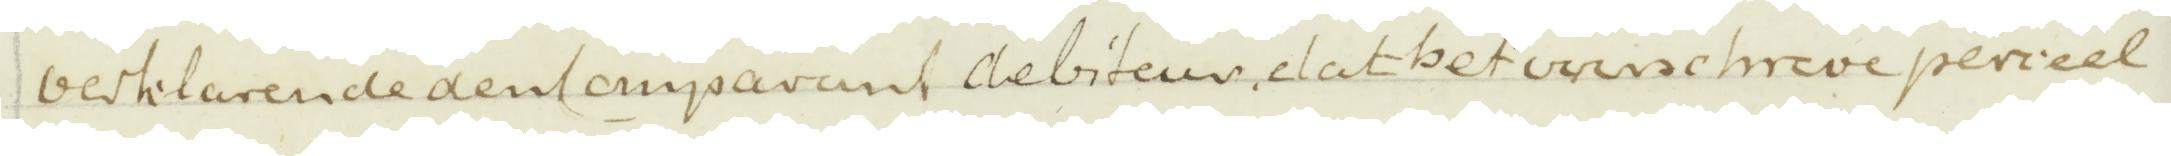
verklarende den Comparant debiteur, dat het voorschreve perceel
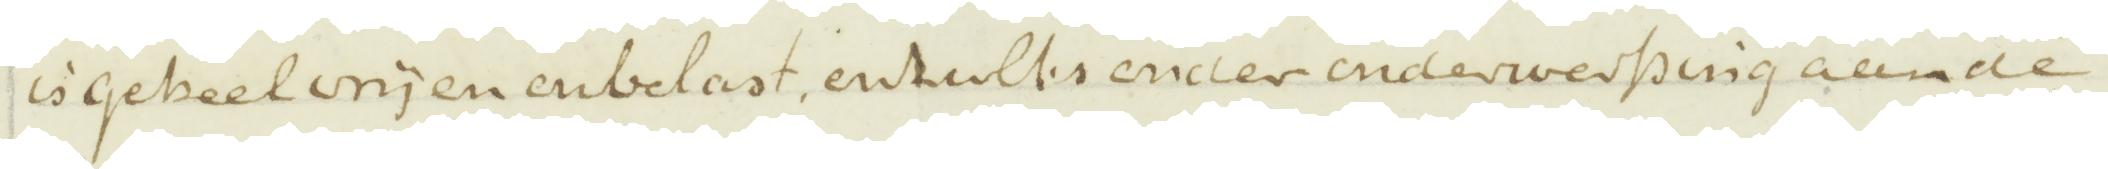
is geheel vrij en onbelast, en zulks onder onderwerping aan de
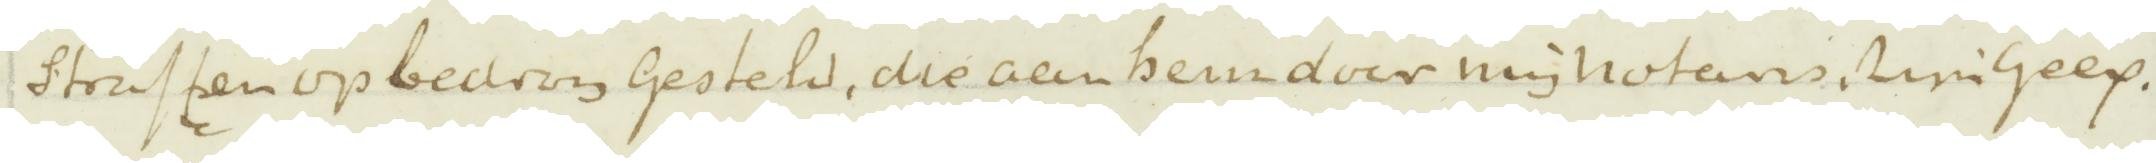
straffen op bedrog Gesteld, die aan hem door mij notaris, zijn geex.
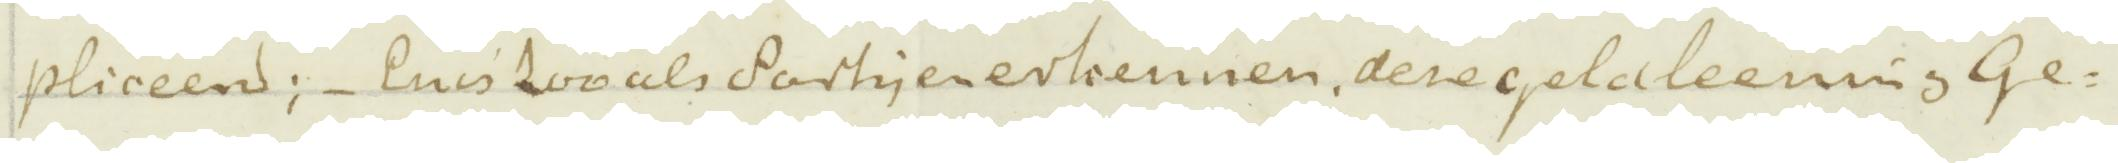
pliceerd; — En is zoo als Partijen erkennen, dese geldleening Ge„
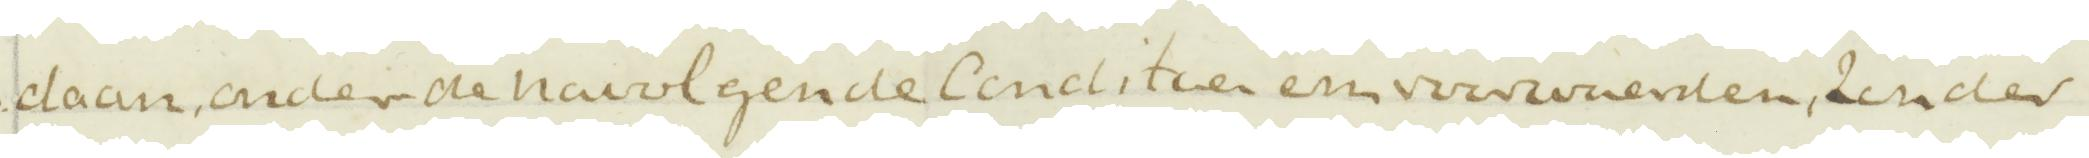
„daan, onder de navolgende Conditien en voorwaerden, zonder
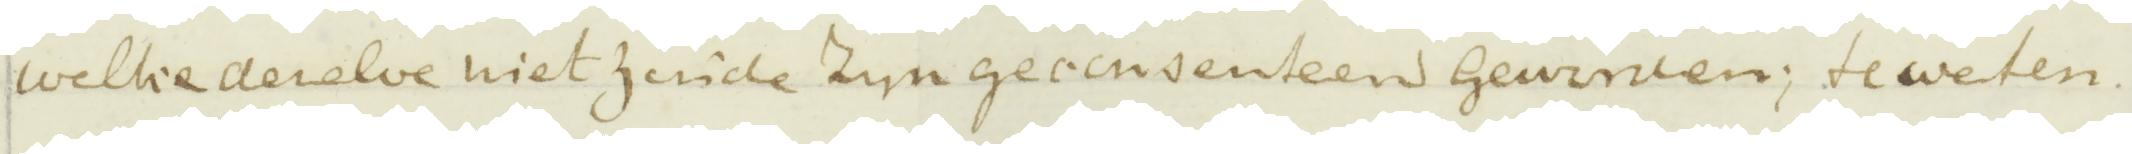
welke deselve niet Zoude zyn geconsenteerd Geworden; te weten
